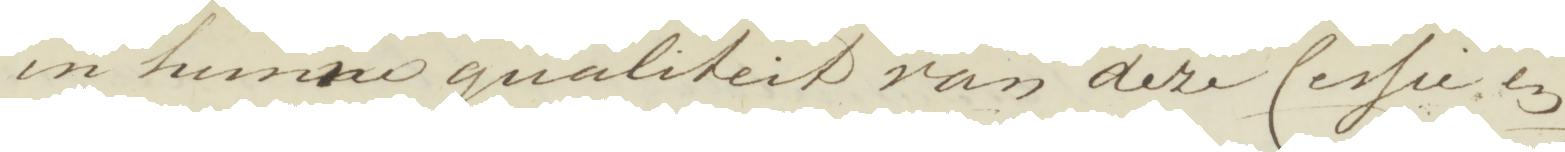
in hunne qualiteit van deze Cessie, en
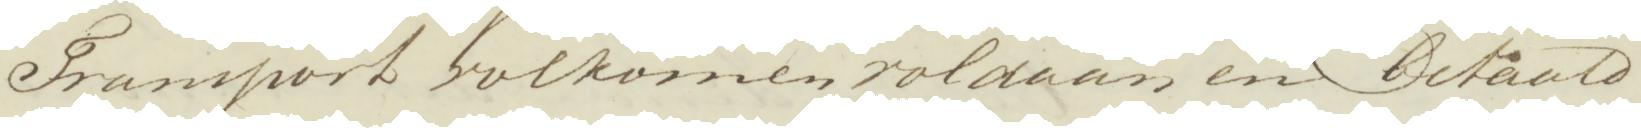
Transport volkomen voldaan en betaald
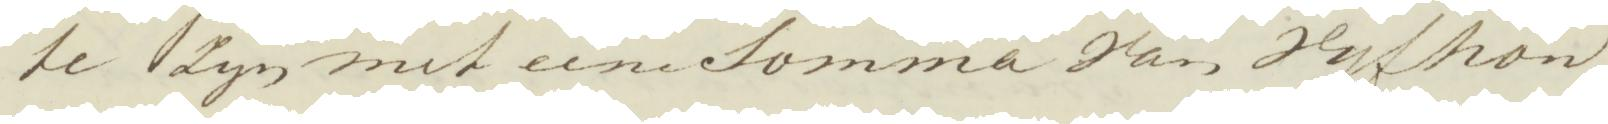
te zijn met eene somma van Vyfhon
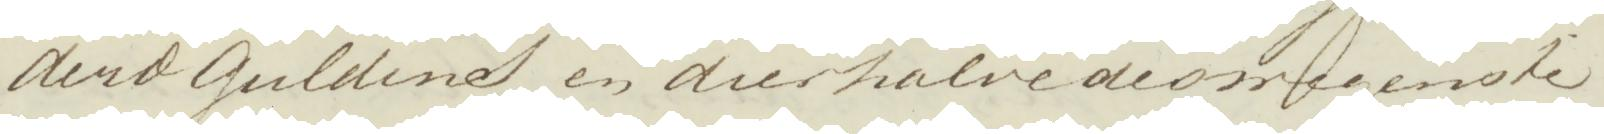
derd Guldens, en dierhalve deswegens te
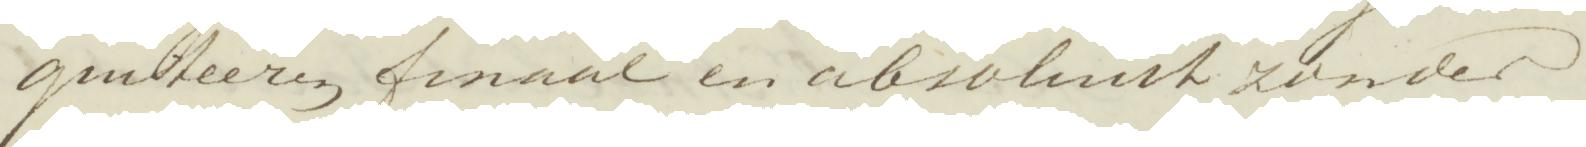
quiteeren finaal en absoluut, zonder
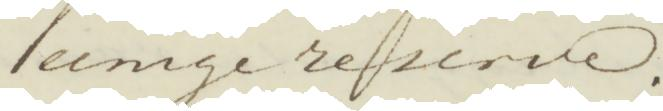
eenige reserve
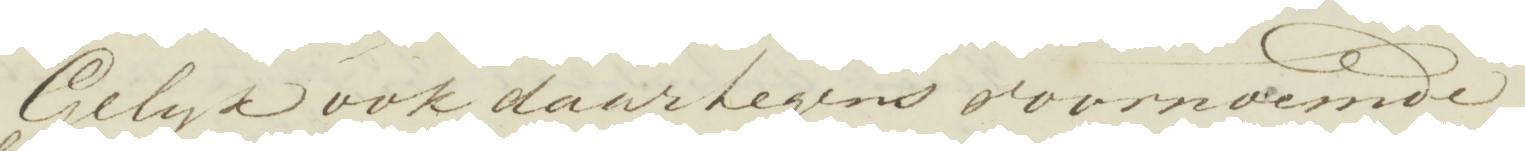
Gelyk ook daartegens voornoemde
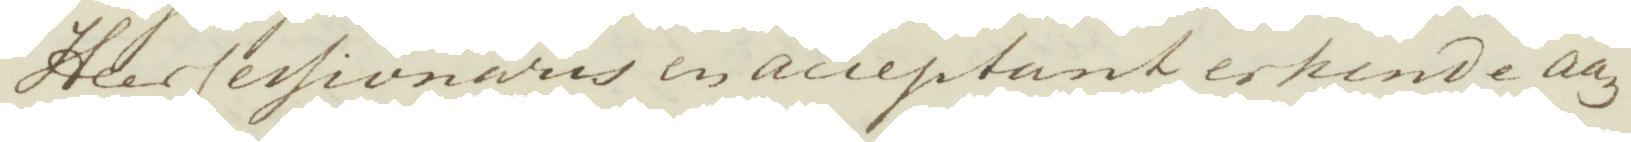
Heer Cessionaris en acceptant erkende aan
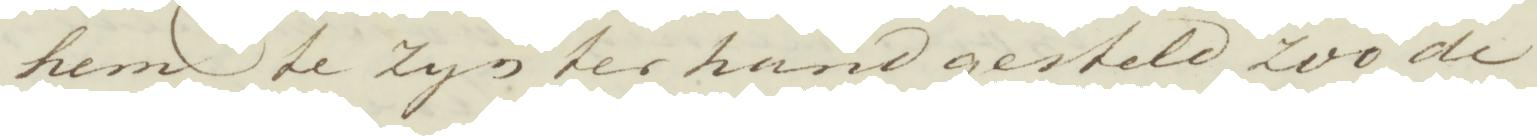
hem te zijn ter hand gesteld, zoo de
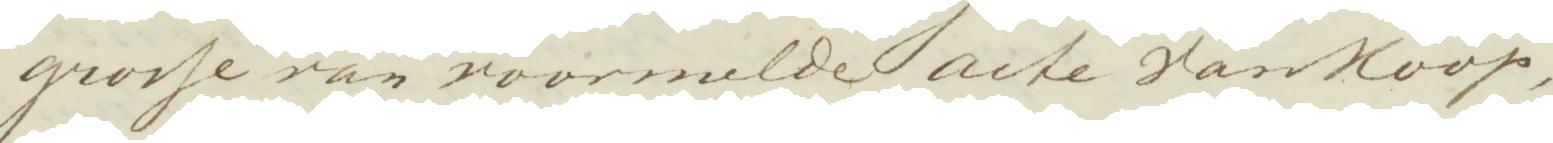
grosse van voormelde acte van Koop,
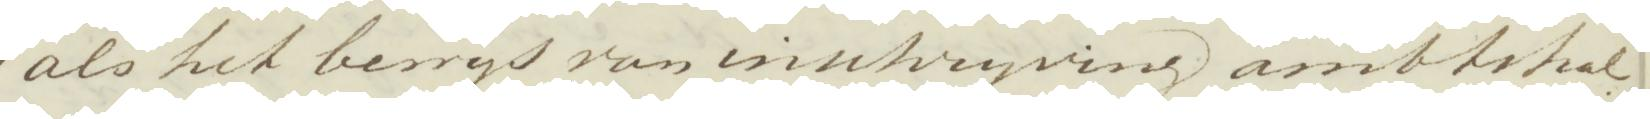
als het bewys van inschryving ambtshal
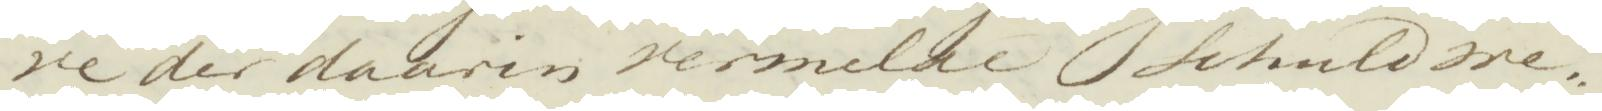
ve der daarin vermelde schuld we„
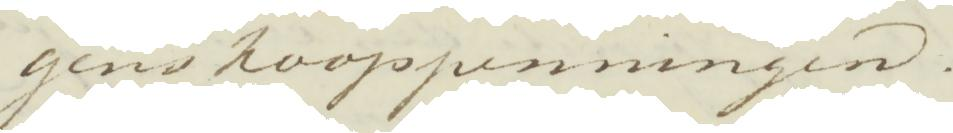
gens kooppenningen.
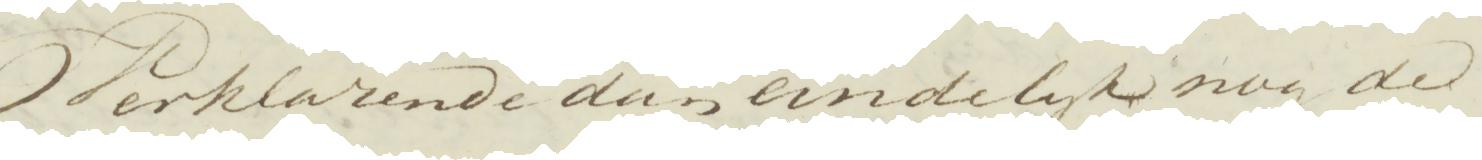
Verklarende dan eindelyk nog de
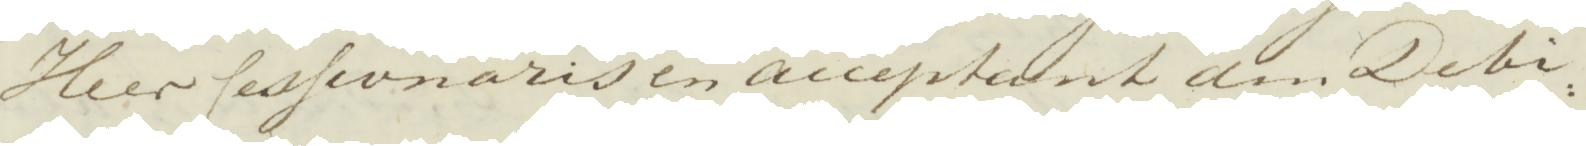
Heer Cessionaris en acceptant den Debi=
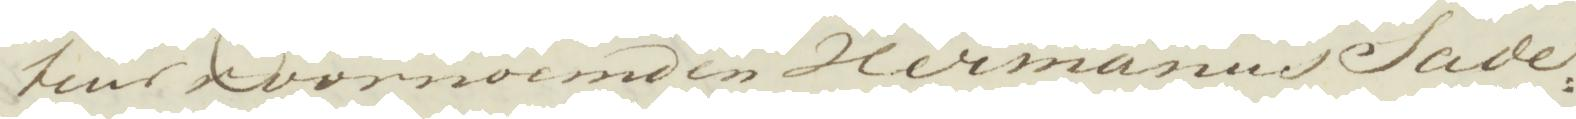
teur voornoemden Hermanus Sade=
